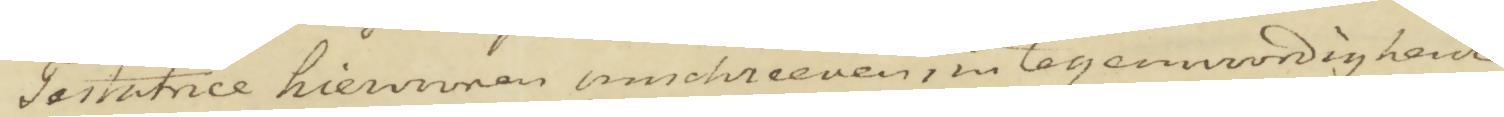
Testatrice hiervooren omschreeven, in tegenwoordigheid
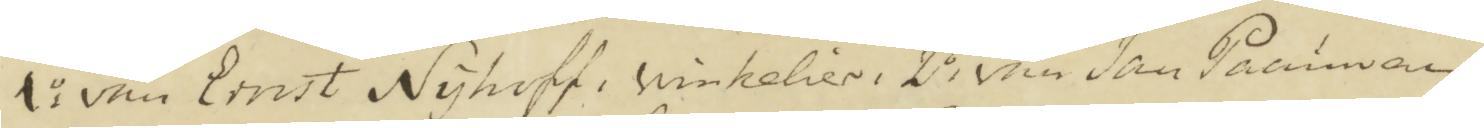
1:o van Ernst Nijhoff, winkelier, 2„o van Jan Paauwen,
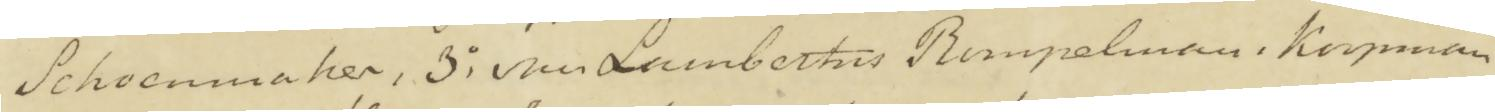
Schoenmaker, 3:o van Lambertus Rompelman, Koopman
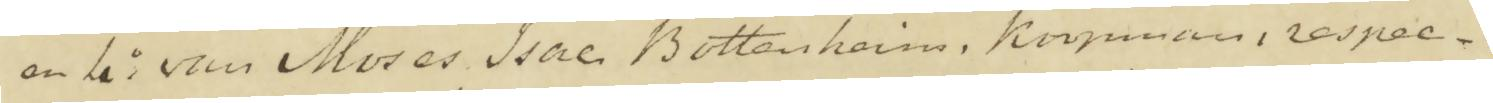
en 4:o van Moses Isac Bottenheim, Koopman, respec=
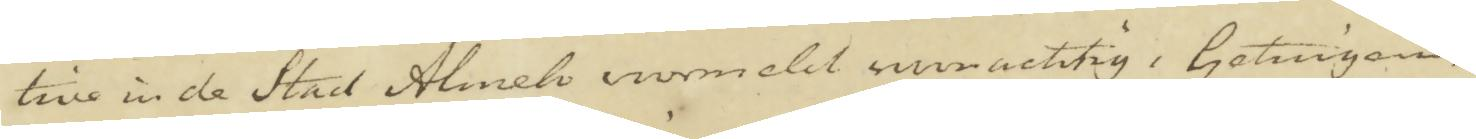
tive in de Stad Almelo voormeld woonachtig, Getuigen,
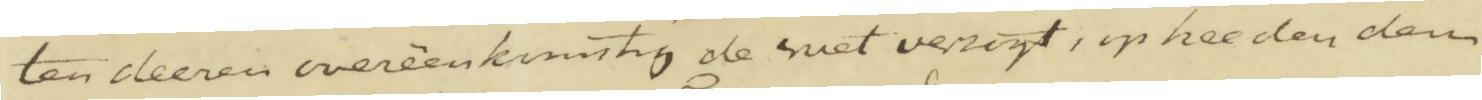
ten deezen overeen komstig de wet verzogt, op heeden den
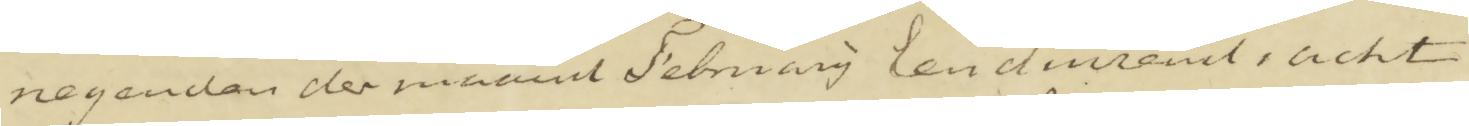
negenden der maand Februarij Een duizend, acht
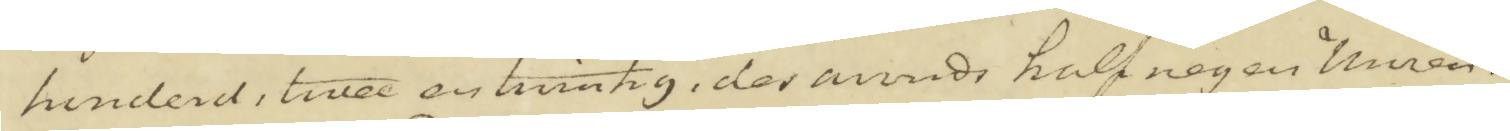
honderd, twee en twintig, der avonds half negen Uuren.
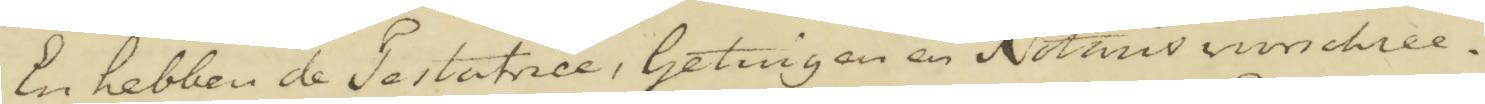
En hebben de Testatrice, Getuigen en Notaris voorschree.
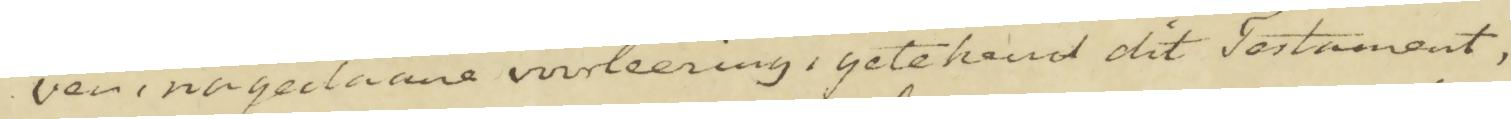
van, nagedaane voorleezing, getekend dit Testament.
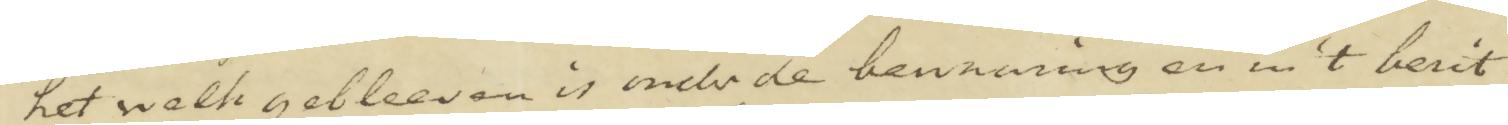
het welk gebleeven is ondr de bewaring en in ’t bezit
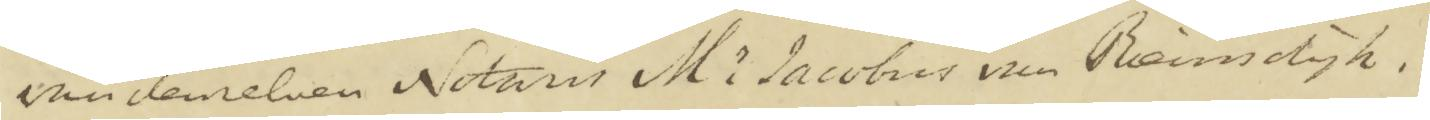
van denzelven Notaris M:r Jacobus van Riemsdijk.
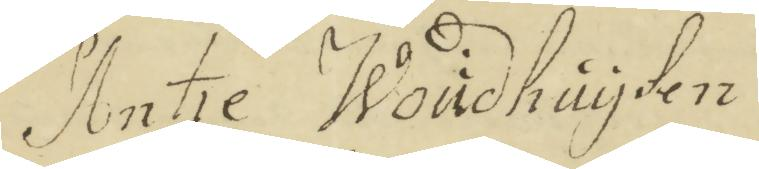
Antje Woudhuijsen
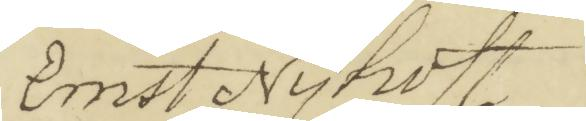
Ernst Nyhoff
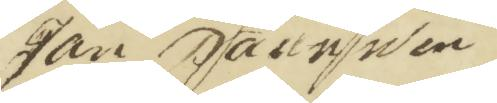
Jan Paauwen
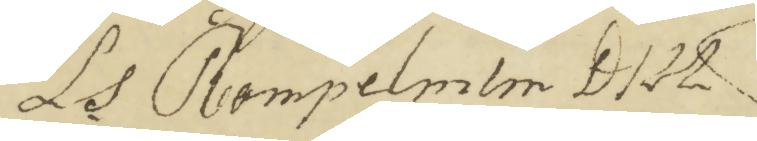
Ls Rompelman D/Zn
